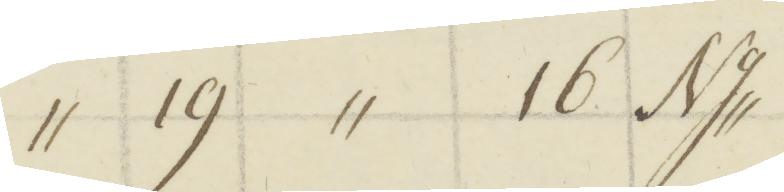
„ 19 „ 16 Ng„
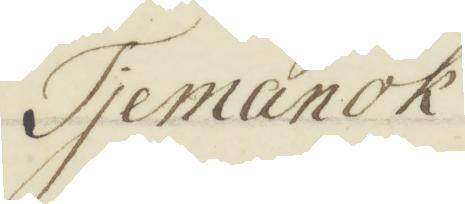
Tjemanok
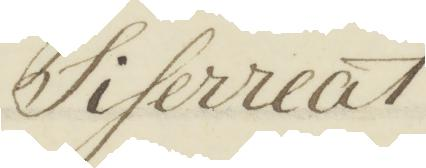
Siserreat
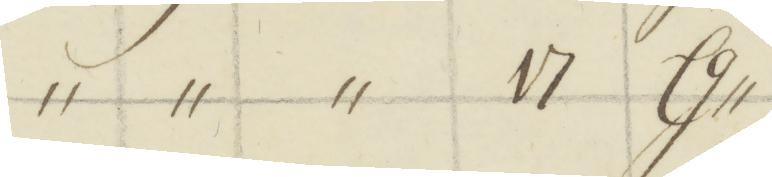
„ „ „ 17 Cg„
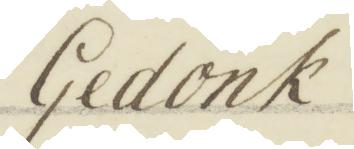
Gedonk
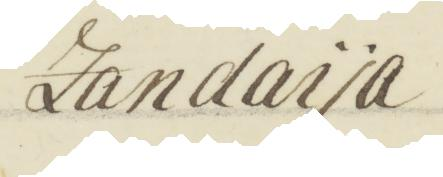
Zandaija
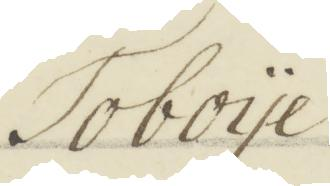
Toboije
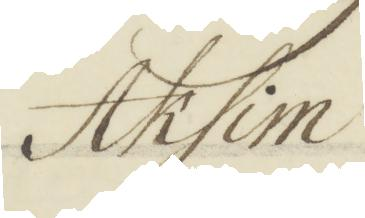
Aksim
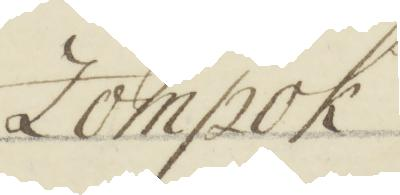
Zompok
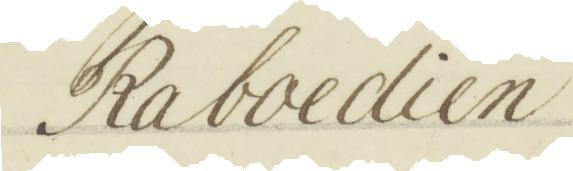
Raboedien
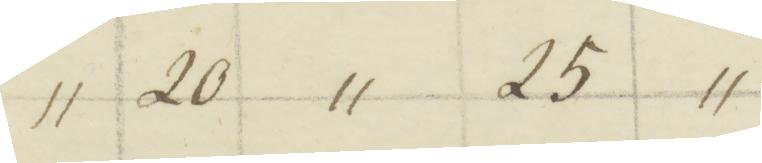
„ 20 „ 25 „
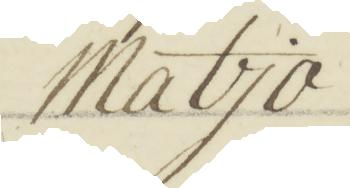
Matjo
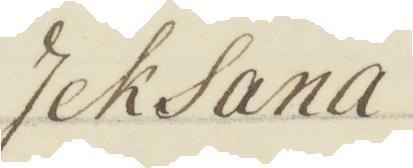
Jeksana
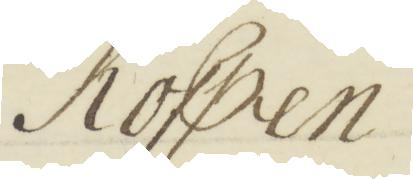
Koppen
